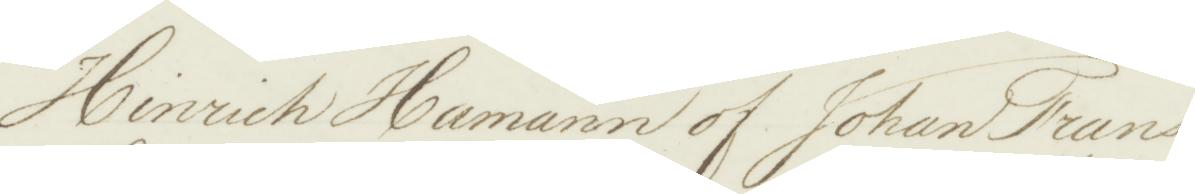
Hinrich Hamann of Johan Frans
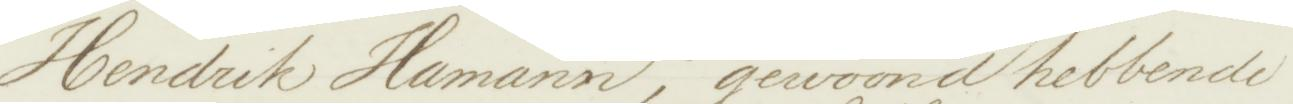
Hendrik Hamann gewoond hebbende
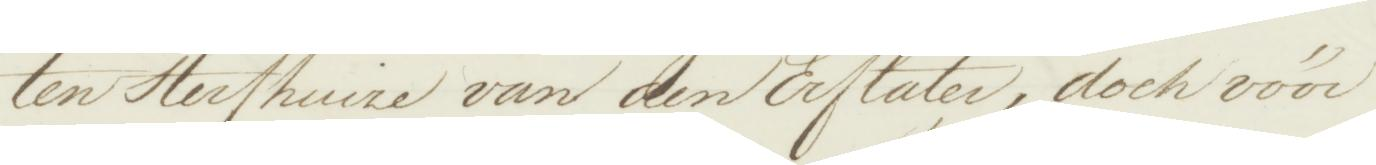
ten sterfhuize van den Erflater, doch vóór
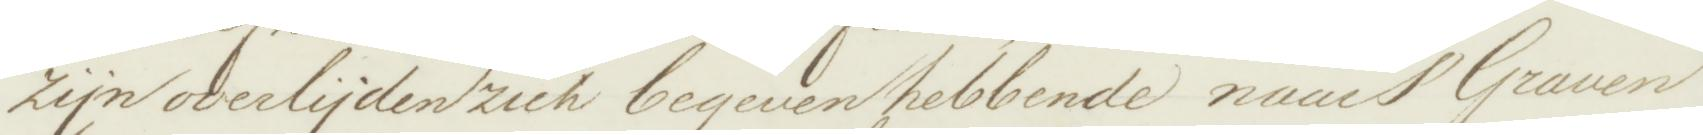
zijn overlijden zich begeven hebbende naar s' Graven
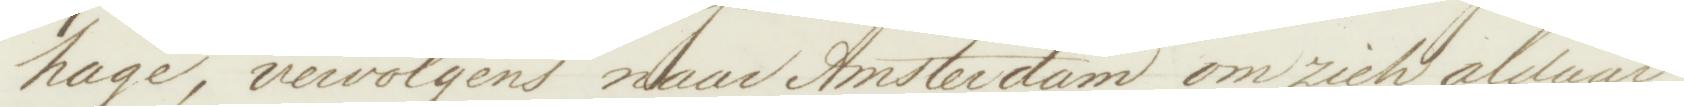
hage, vervolgens naar Amsterdam om zich aldaar
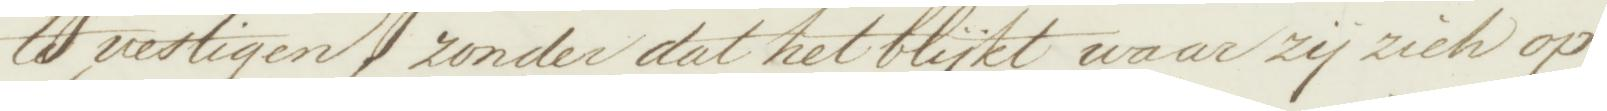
te vestigen, zonder dat het blijkt waar zij zich op
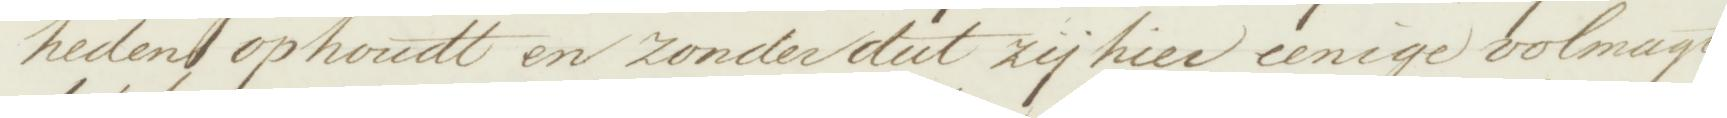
heden ophoudt en zonder dat zij hier eenige volmagt
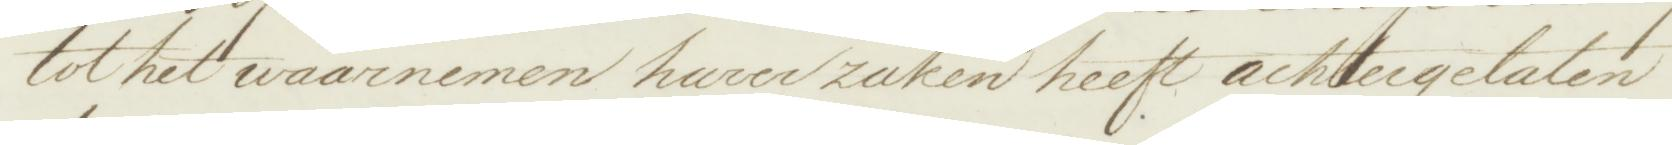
tot het waarnemen harer zaken heeft achtergelaten
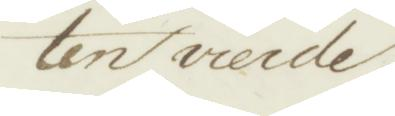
ten vierde
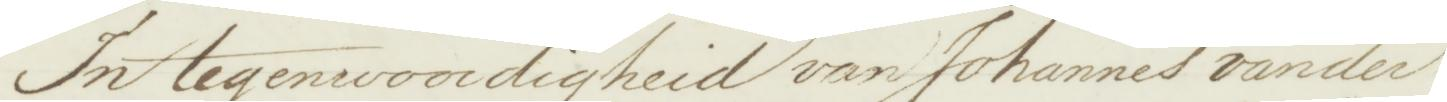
In tegenwoordigheid van Johannes van der
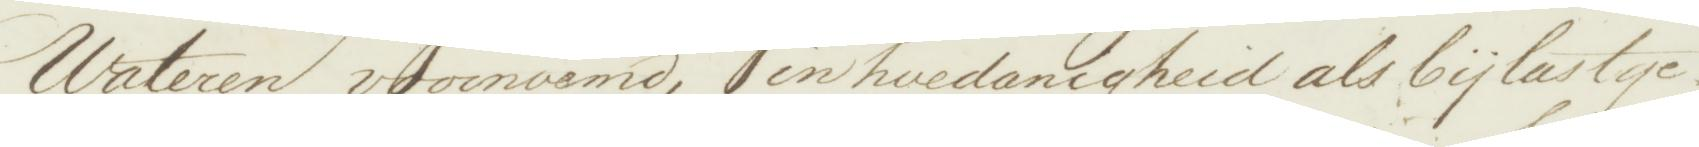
Wateren voornoemd, in hoedanigheid als bij lastge
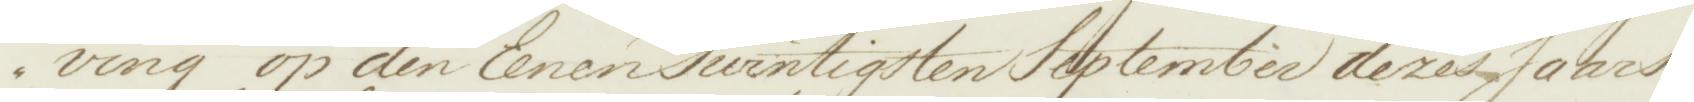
„ving op den Eenen Twintigsten September dezes Jaars
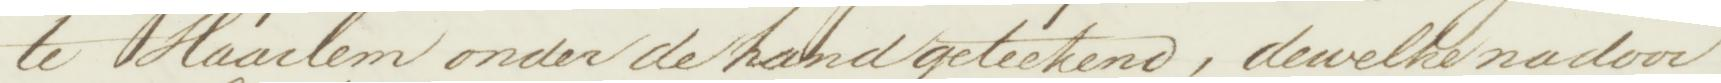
te Haarlem onder de hand geteekend, dewelke na door
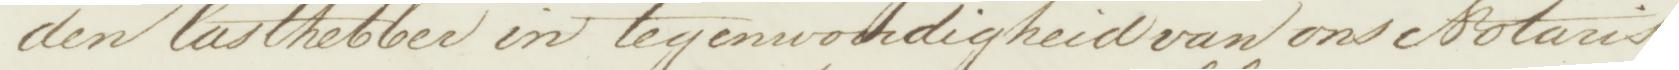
den lasthebber in tegenwoordigheid van ons Notaris
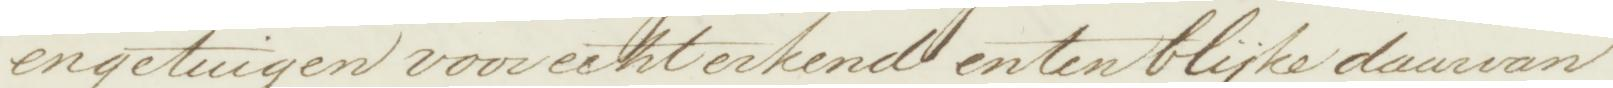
en getuigen voor echt erkend en ten blijke daarvan
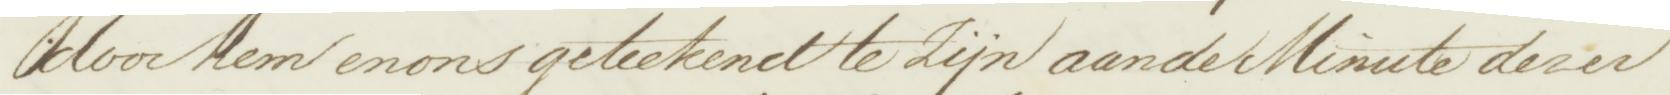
door hem en ons geteekend te zijn aan de Minute dezer
